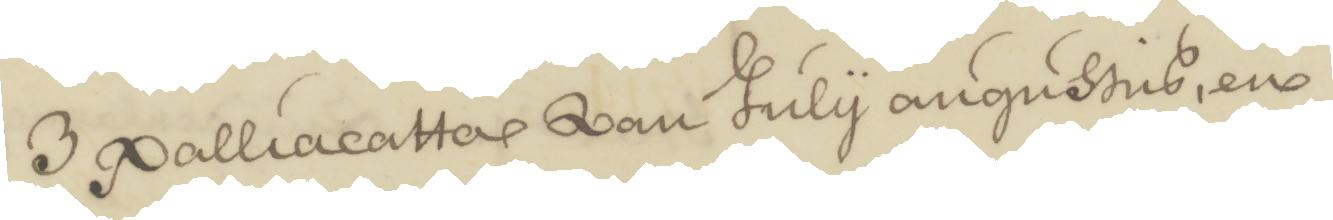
3 palliacatta van Iulij augustus, en
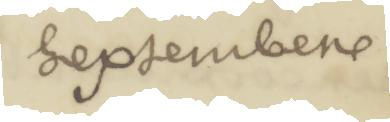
september
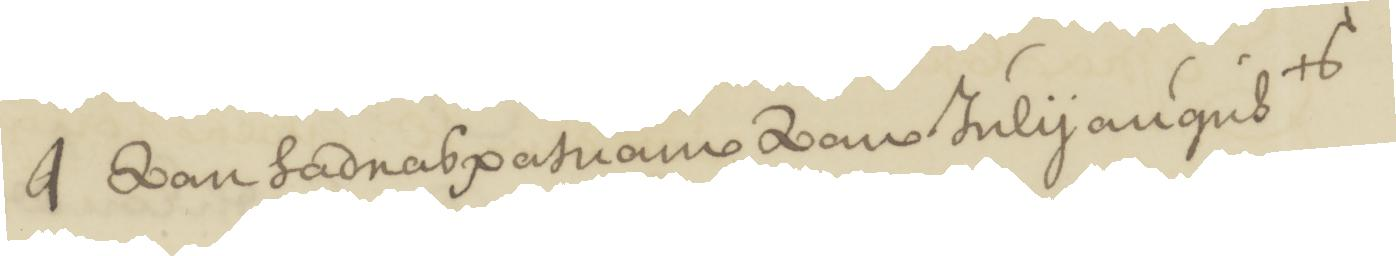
4 van sadraspatnam van Iulij augusts
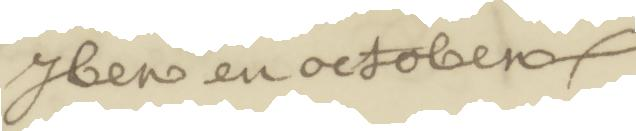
7ber en october —
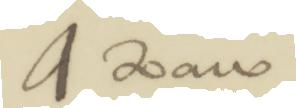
4 van
